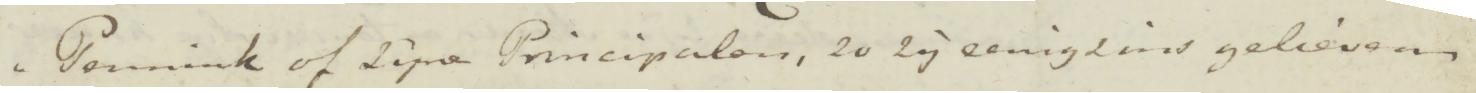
„ Pennink of zijne Principalen, zo zij eenigtins gelieven
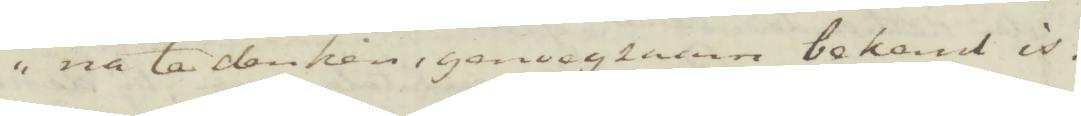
„ na te denken, genoegzaam bekend is.
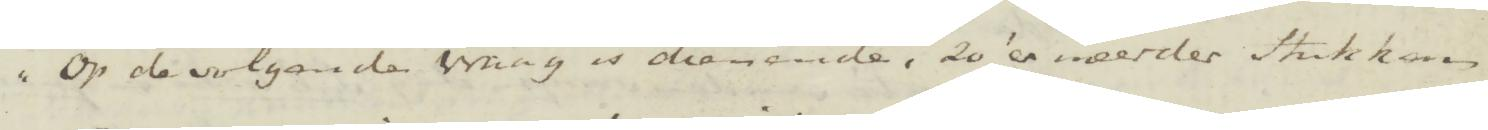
„ Op de volgende vraag is dienende, ze er meerder Stukken
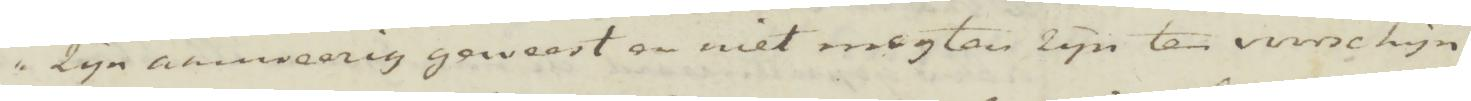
„ zijn aanwezig geweest en niet mogten zijn ten voorschijn
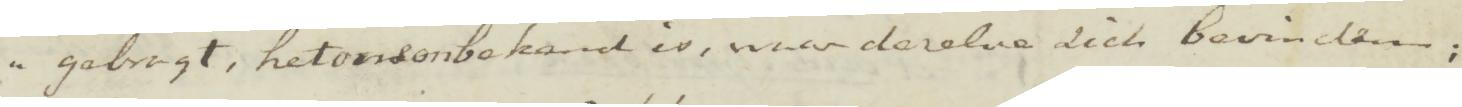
„ gebragt, het ons onbekend is, waar dezelve zich bevinden.
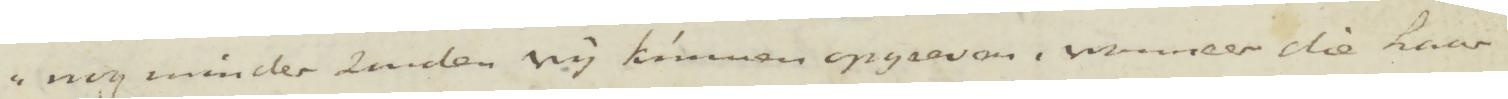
„nog minder zouden wij kunnen opgeeven, wanneer die haar
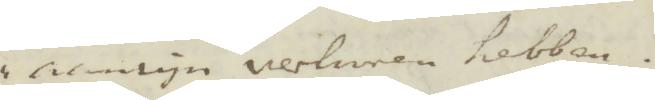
„aanzijn verloren hebben.
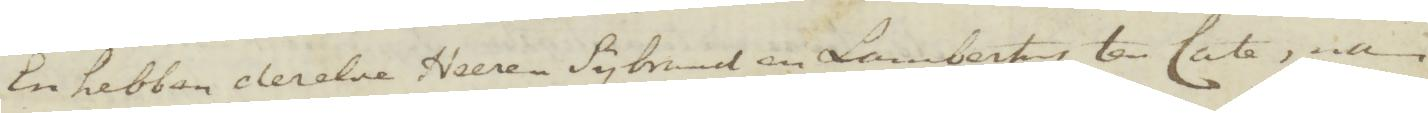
En hebben dezelve Heeren Sijbrand en Lambertus ten Cate, na
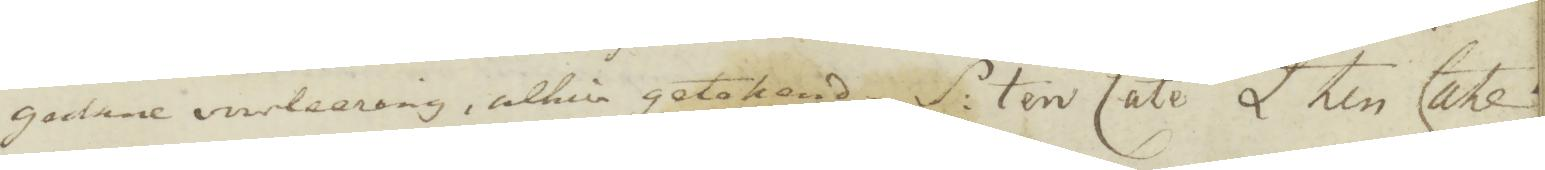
gedane voorleezing, alhier getekende S: ten Cate L ten Cate
